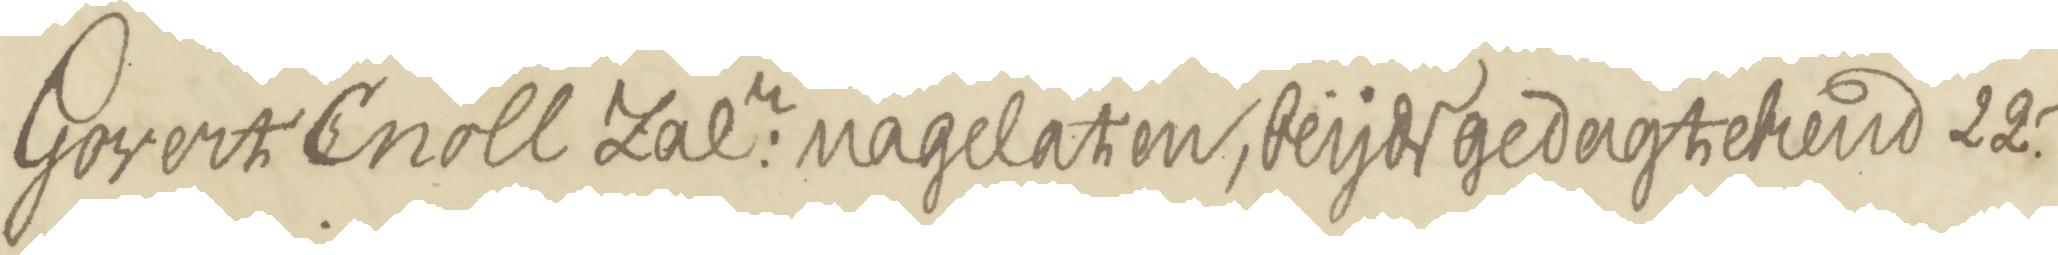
Govert Cnoll Zal:r nagelaten, beijde gedagtekend 22.'
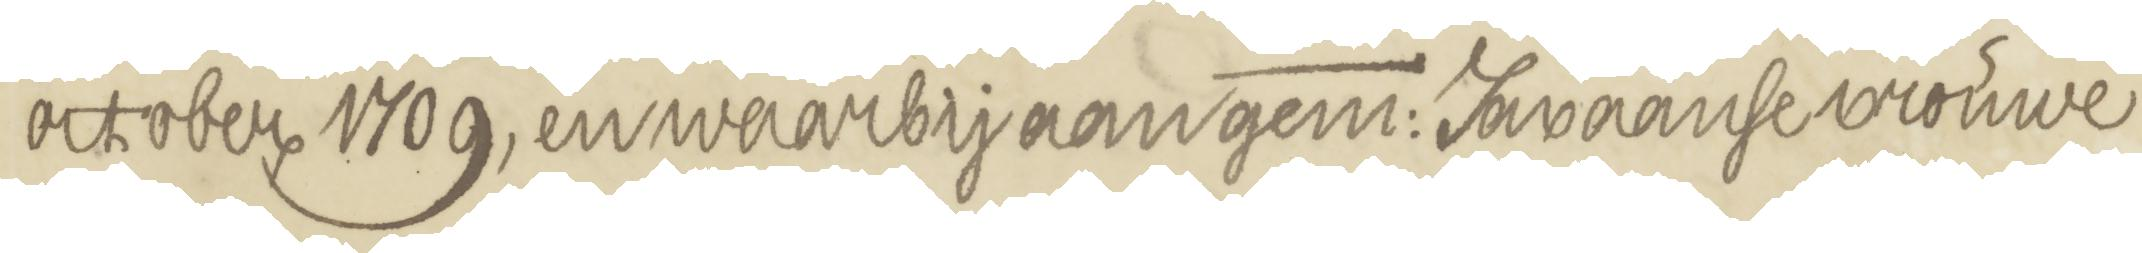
october 1709, en waarbij aan gem: Javaanse vrouwe
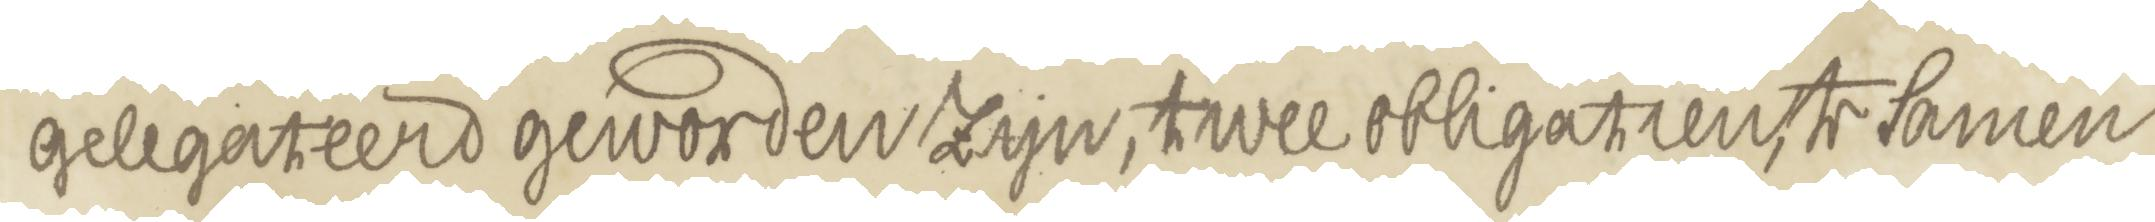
gelegateerd geworden zijn, twee obligatien, te samen
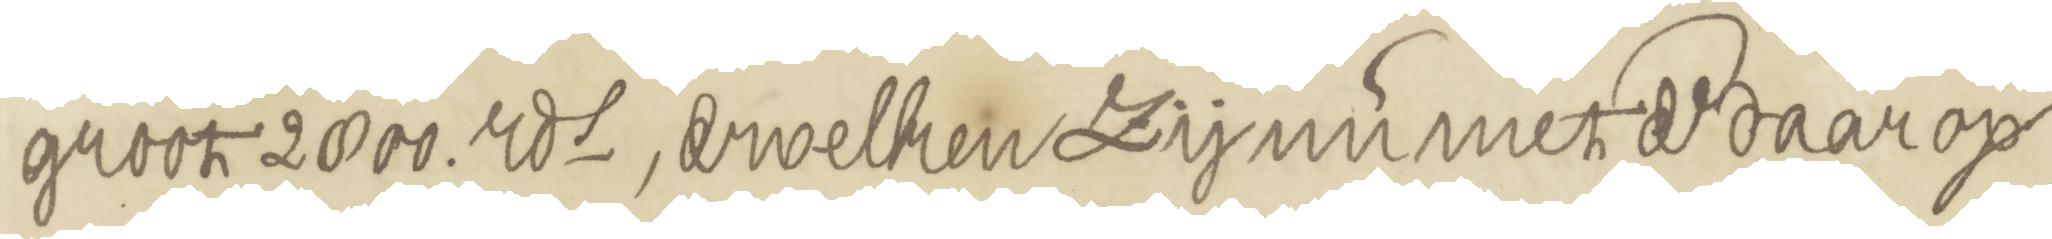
groot 2800. rd-s, dewelken zij nu met de daar op
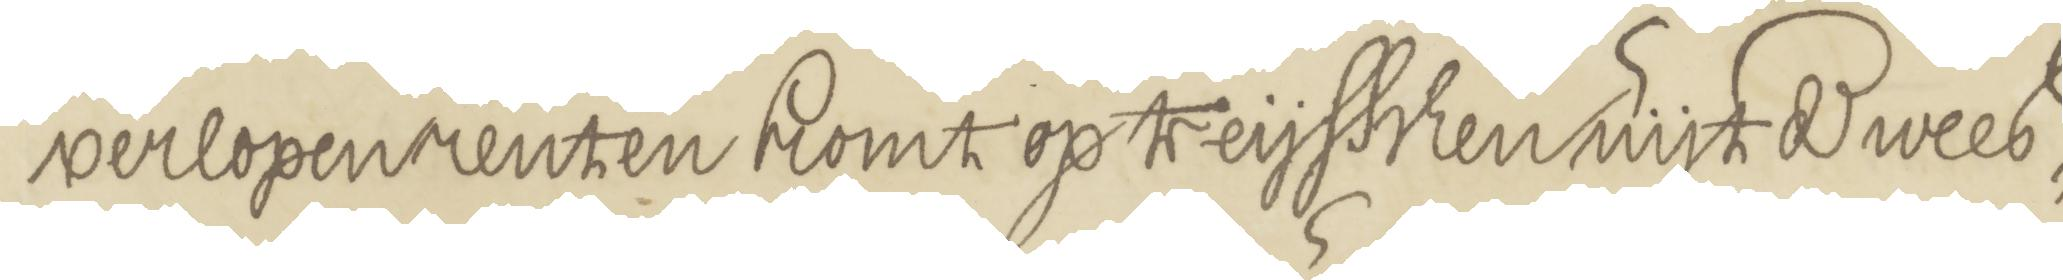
verlopen renten komt op te eijsschen uijt de wees
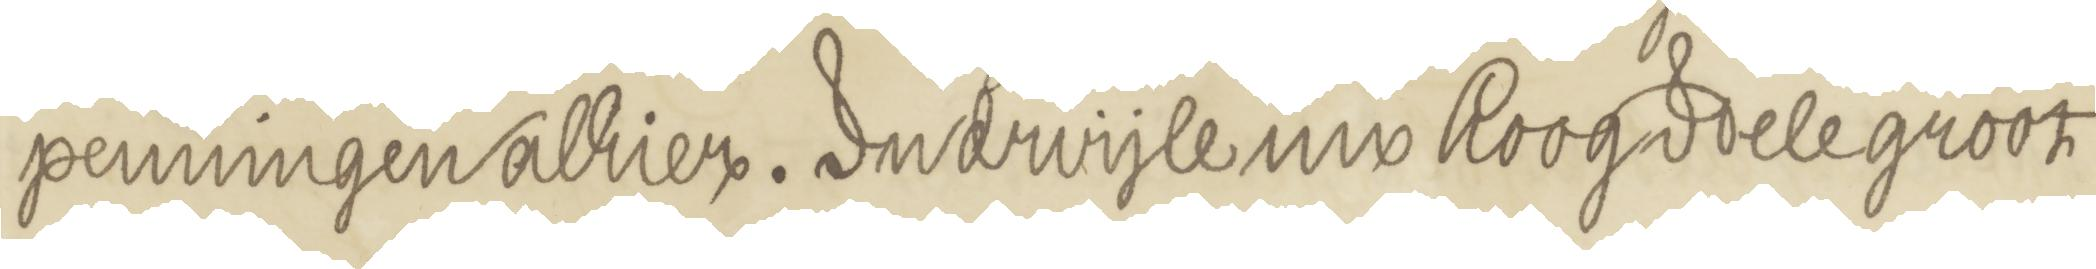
penningen alhier. En dewijle uw hoog Edele groot
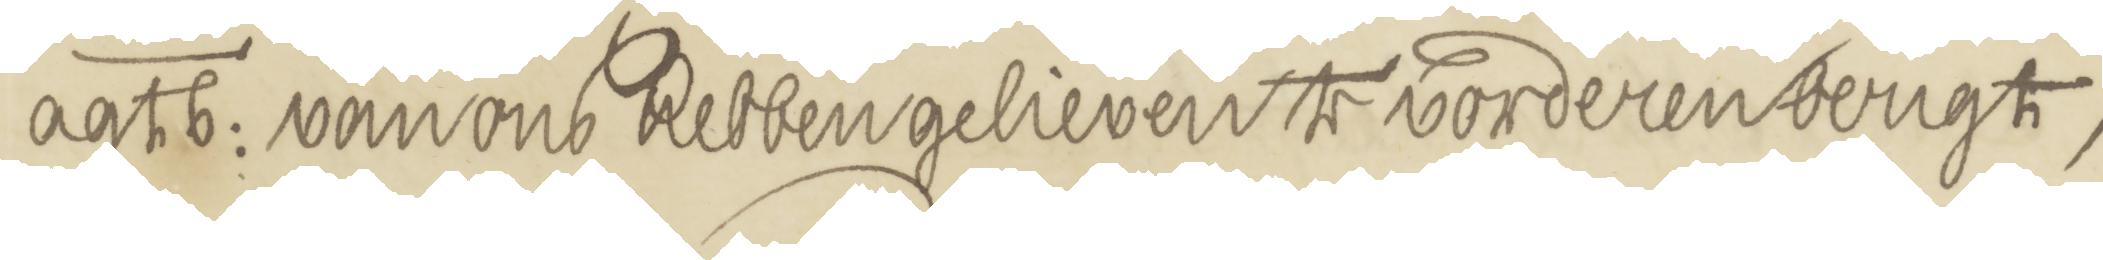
agtb: van ons hebben gelieven te vorderen berigt,
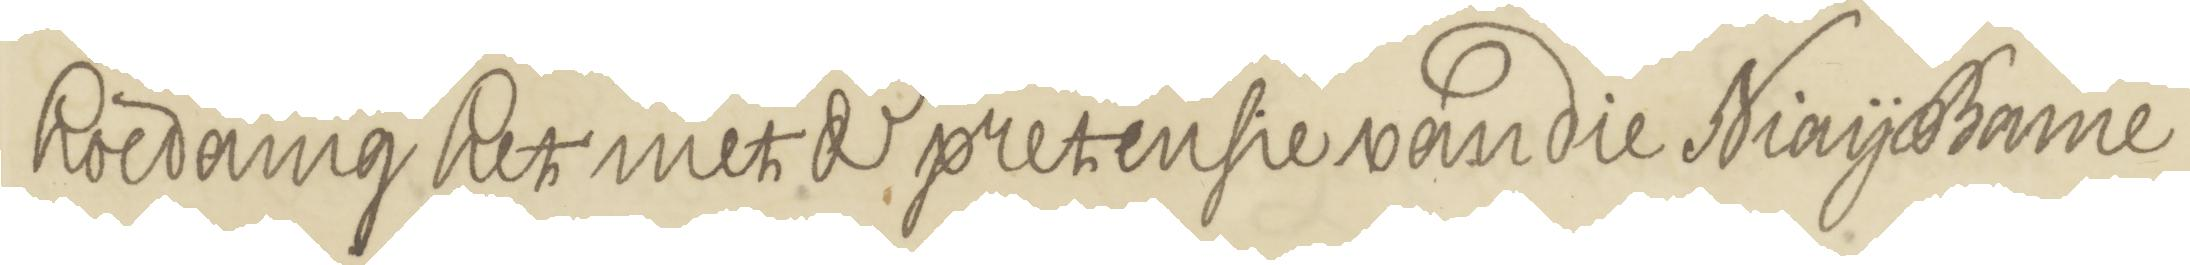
hoedanig het met de pretensie van die Niaij Banie
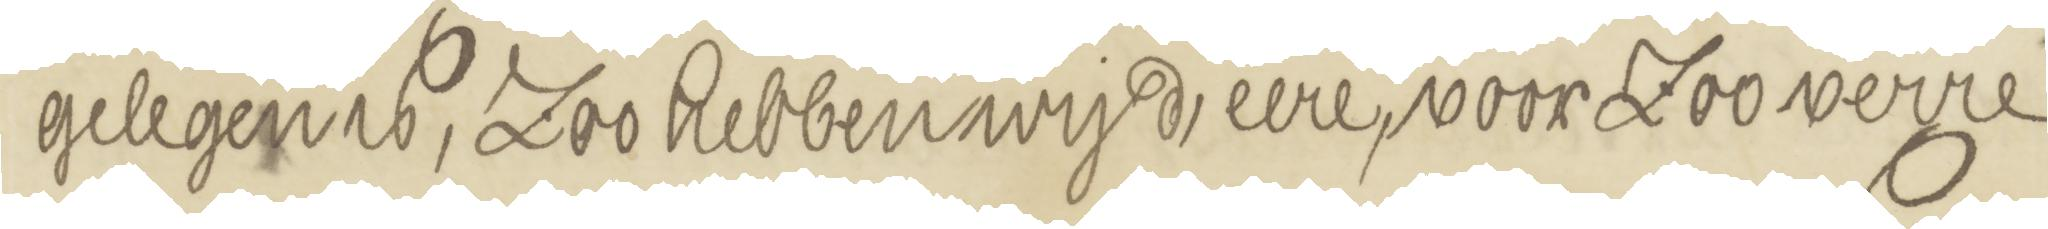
gelegen is, zoo hebben wij d' eere, voor zoo verre
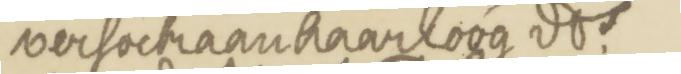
versoek aan haar hoog Ed:s
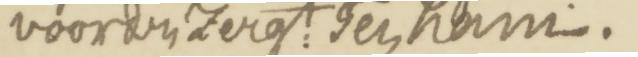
voor den zerg:t Ten ham.
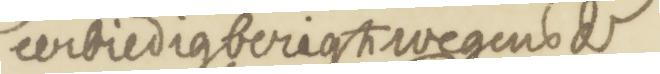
eerbiedig berigt wegens de
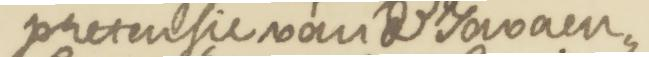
pretensie van de Javaen„
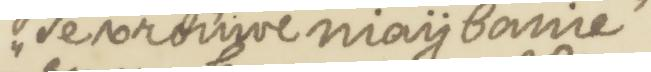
„se vrouwe niaij banie
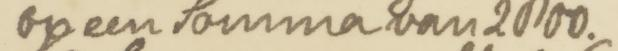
op een somma van 2800.
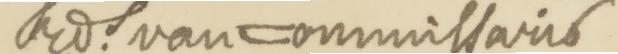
rd:s van commissaris
